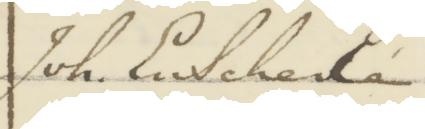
Joh. Enschedé
